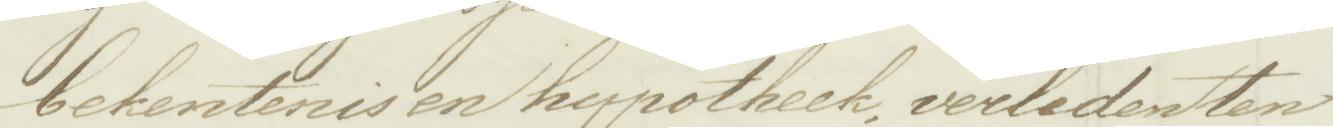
bekentenis en hypotheek, verleden ten
